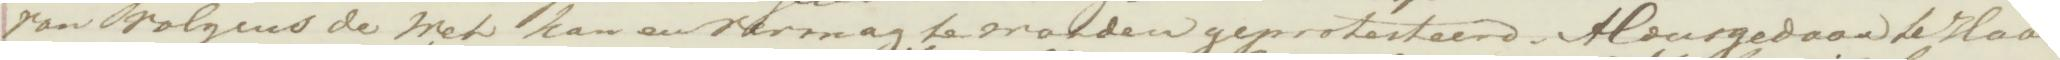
van Volgens de wet kan en vermag te worden geprotesteerd. Aldus gedaan te Haar
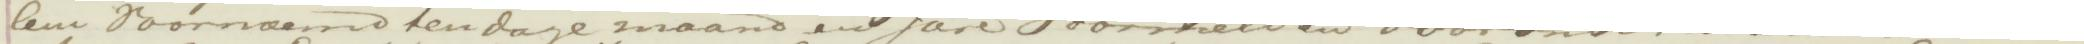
lem voornoemd ten dage maand en Jare Voormelden door ons Notaris benevens
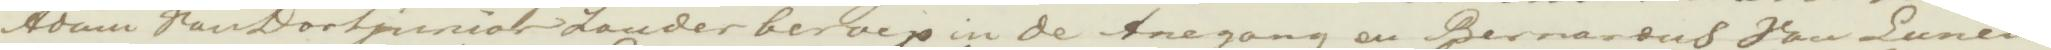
Adam van Dort junior zonder beroep in de Anegang en Bernardus van Lunen
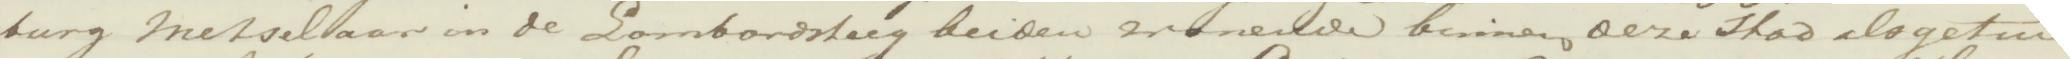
burg metselaar in de Lombordsteeg beiden wonende binnen deze Stad als getui
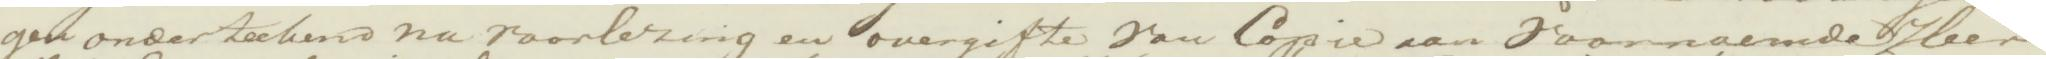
gen onderteekend na voorlezing en overgifte van Copie aan Voornoemde Heer
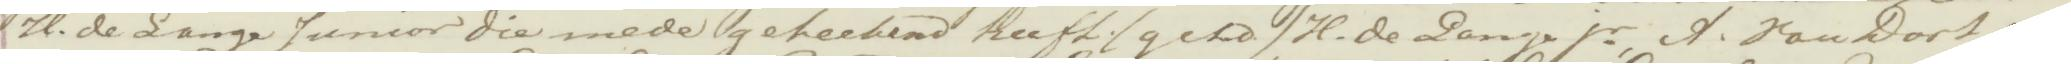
H. de Lange Junior die mede geteekend heeft (getd/ H. de Lange J=r A. Van Dort p=r
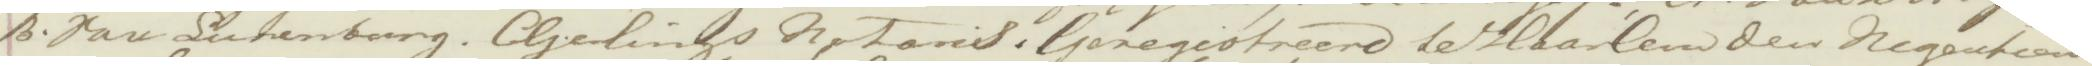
B. van Lunenburg, C Gerlings Notaris, Geregistreerd te Haarlem den Negentien
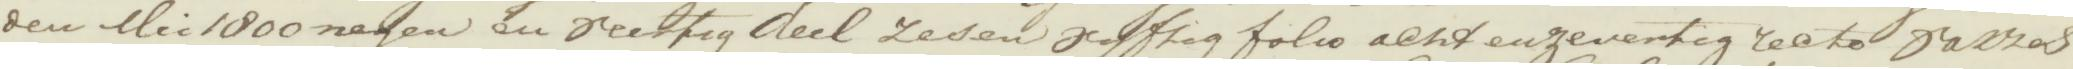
den Mei 1800 negen en veertig deel zes en vyftig folio acht en zeventig recto Valzes
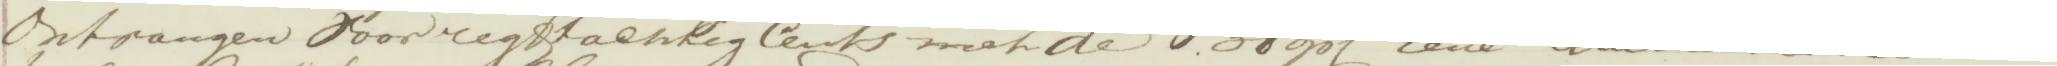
Ontvangen Voor regt tachtig Cents met de 38 opC Eene Gulden tien en een
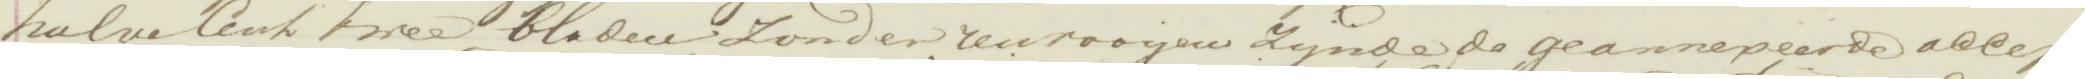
halve Cent twee bladen zonder renvooijen zijnde de geannexeerde accep
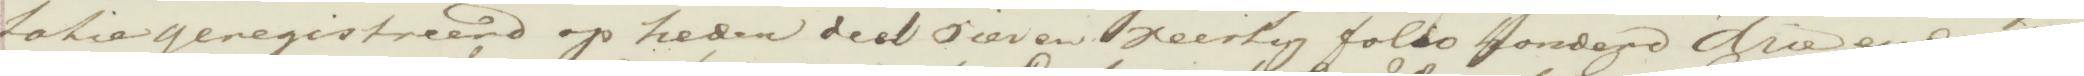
tatie geregistreerd op heden deel vier en Veertig folio honderd drie endertig
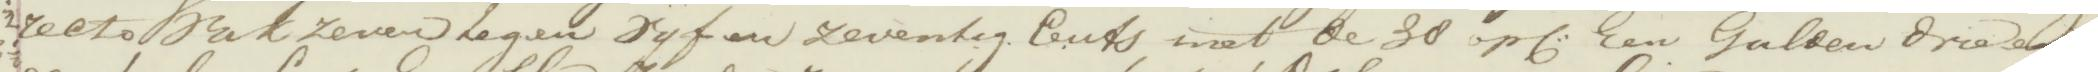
recto Vak zeven tegen Vijf en zeventig Cents met de 38 opC: Een Gulden drie en
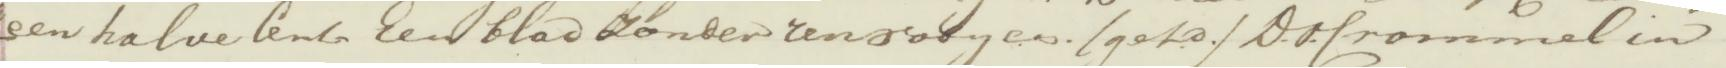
een halve Cent Een blad zonder renvooyen. /getd:/ D Crommelin
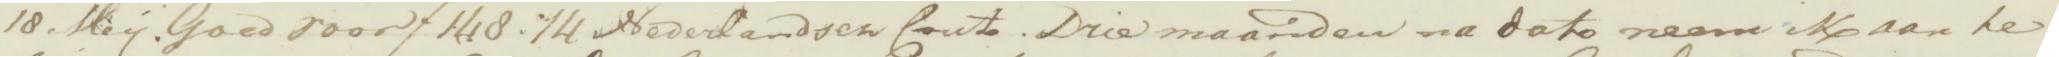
18 Meij, Goed voor ƒ 148.74 Nederlandsch Cent. Drie maanden na dato naam ik aan te
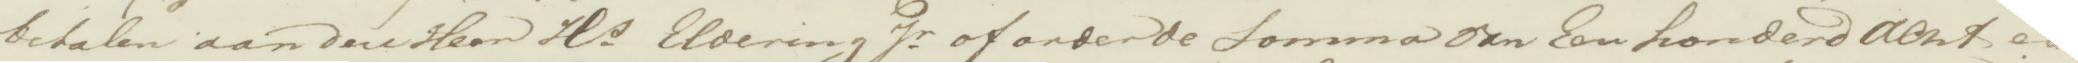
betalen aan den Heer H=s Eldering J:r of onder de Somma van Een honderd Acht en
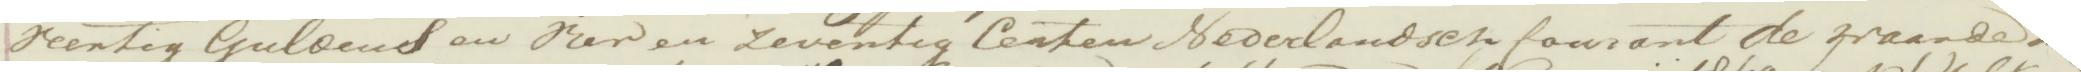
Veertig Guldens en Vier en zeventig Centen Nederlandsch Courant de waarde op
